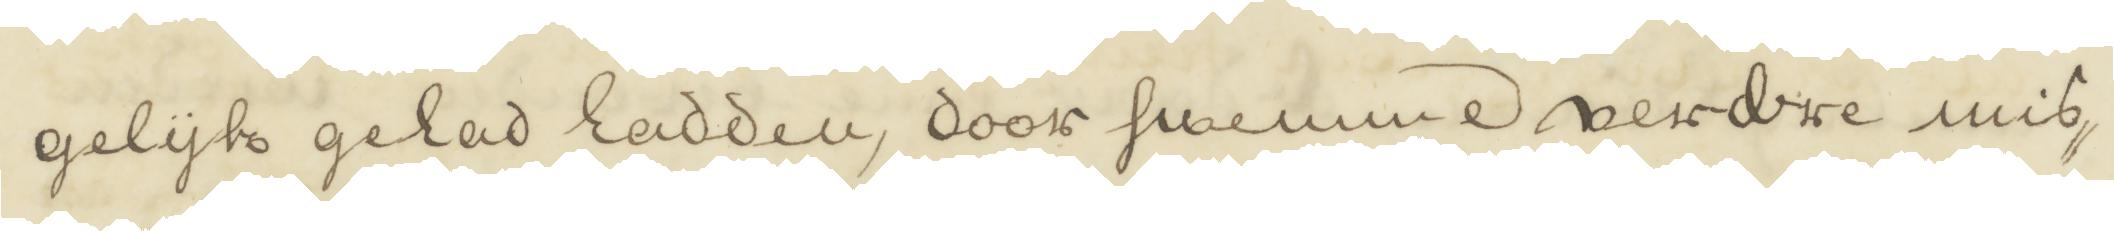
gelijk gehad hadden, door swemme verdere mis„
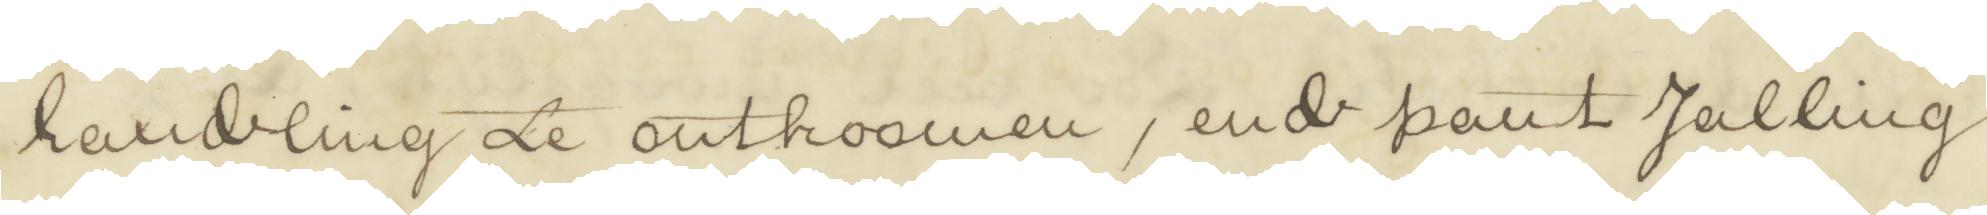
handeling te ontkoomen, ende pant Jalling
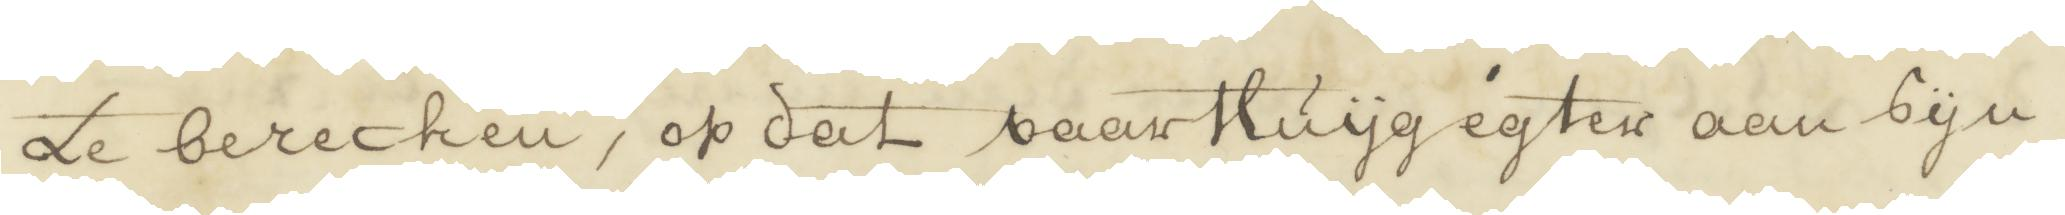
te berecken, op dat vaarthuijg egter aan sijn
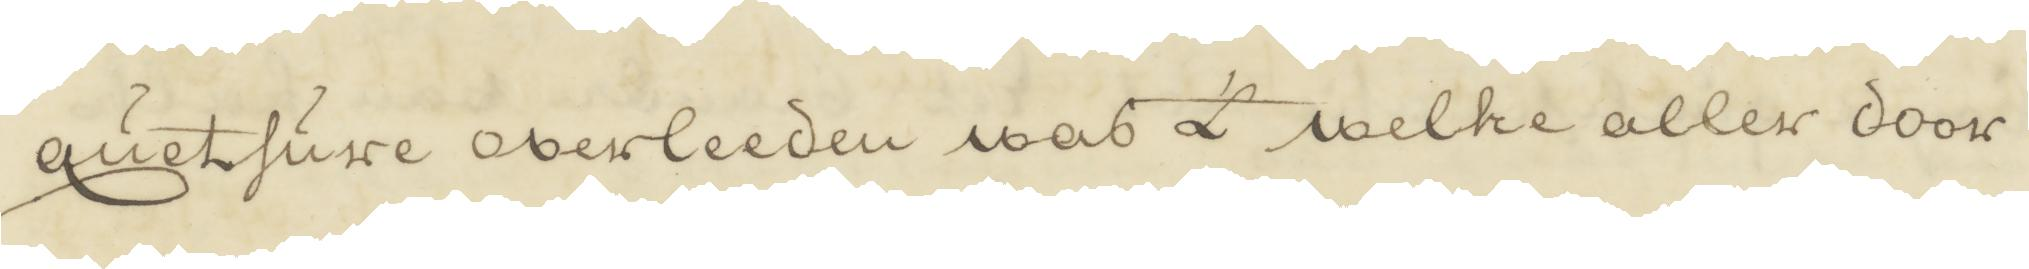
quetsure overleeden was 't welke aller door
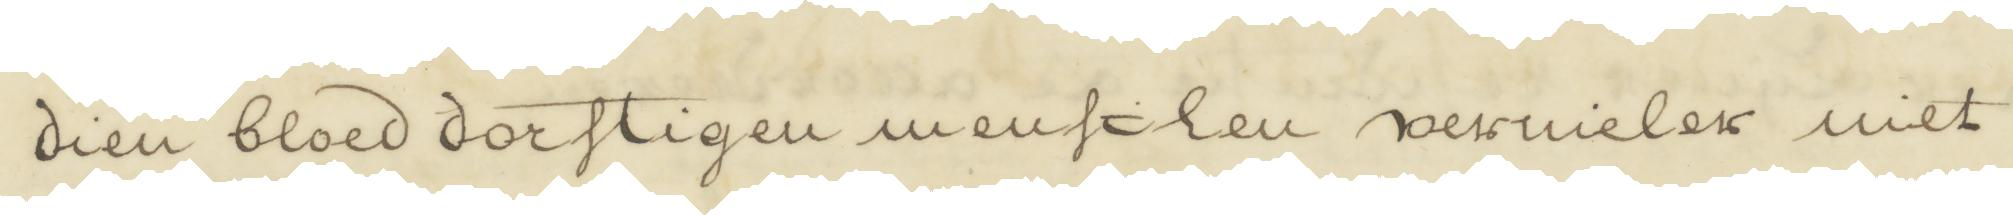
dien bloed dorstigen menschen vernieler niet
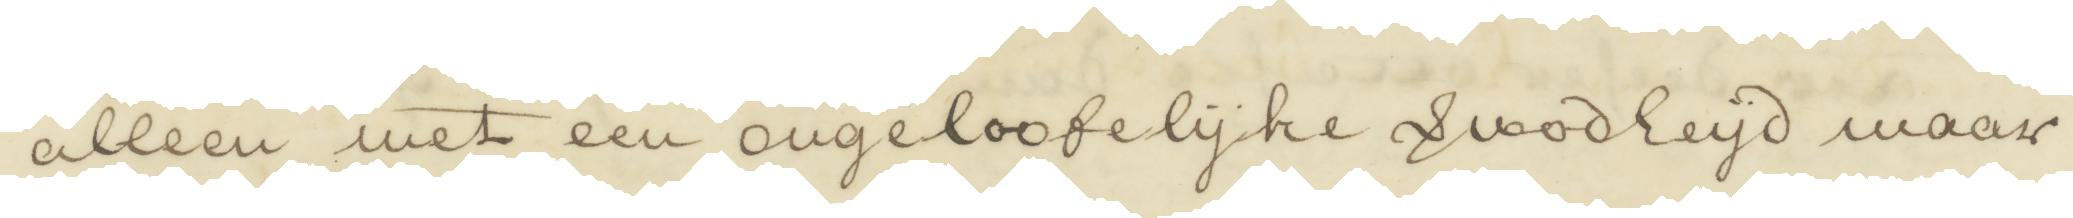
alleen met een ongeloofelijke verwodheijd maar
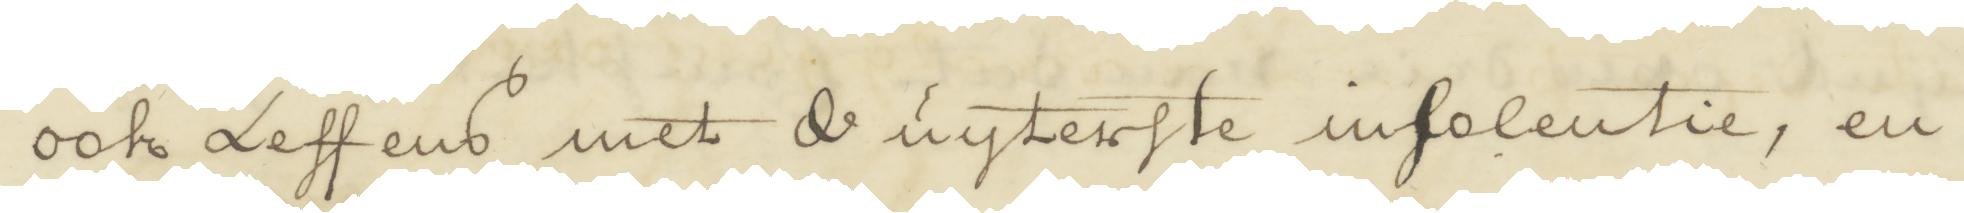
ook Leffens met de uyterste insolentie, en
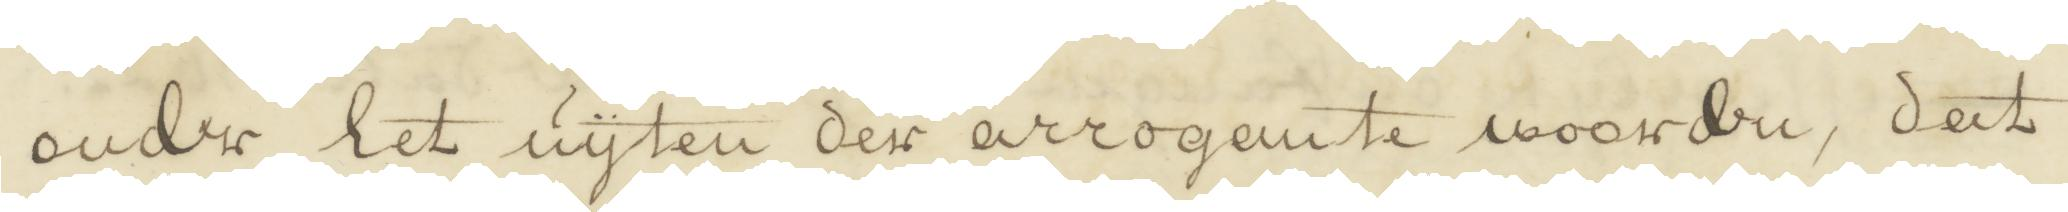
onder het uijten der arrogante woorden, dat
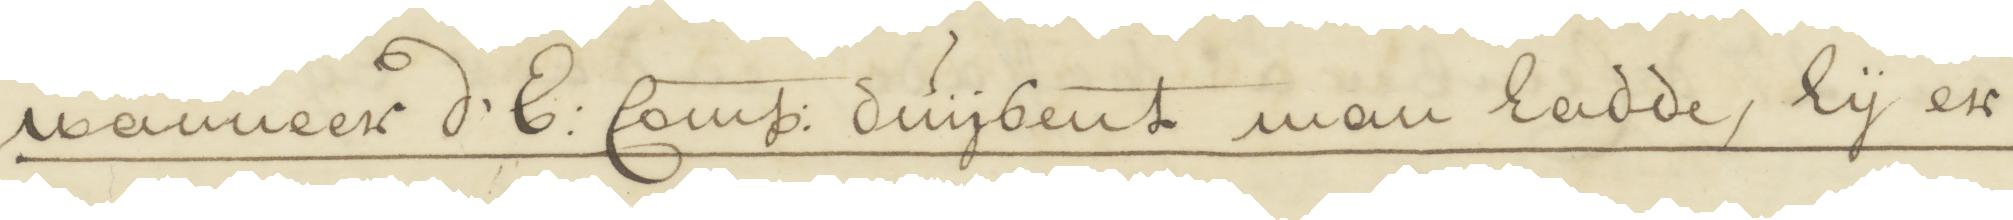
wanneer d’ E: Comp: duijsent man hadde, hij er
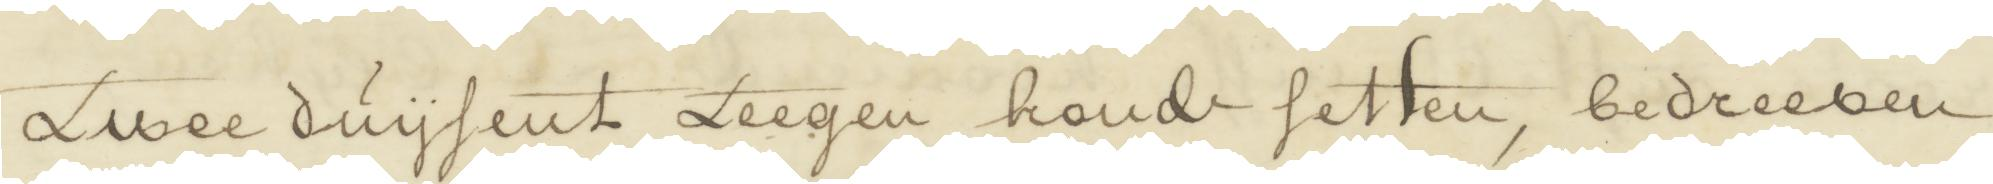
twee duijsent teegen konde setten, bedreeven
